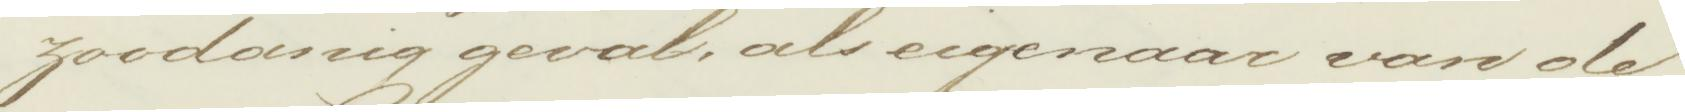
zoodanig geval, als eigenaar van de
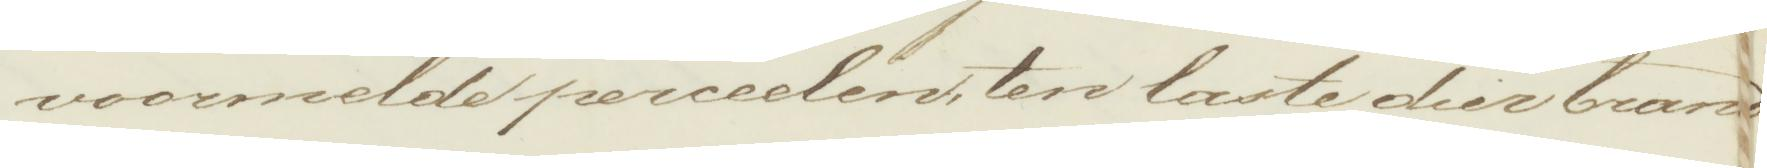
voormelde perceelen, ten laste dier brand
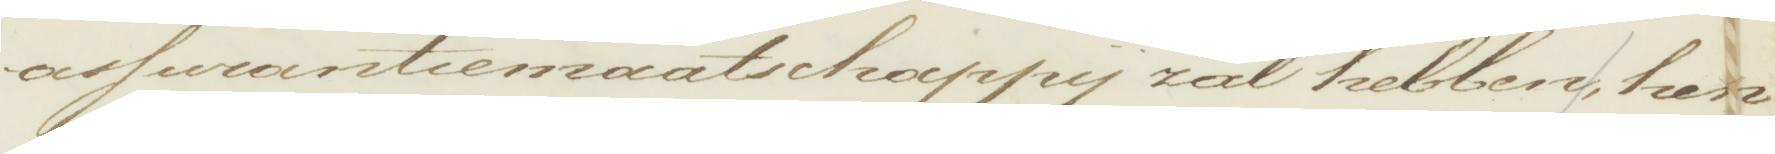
assurantiemaatschappij zal hebben], hen
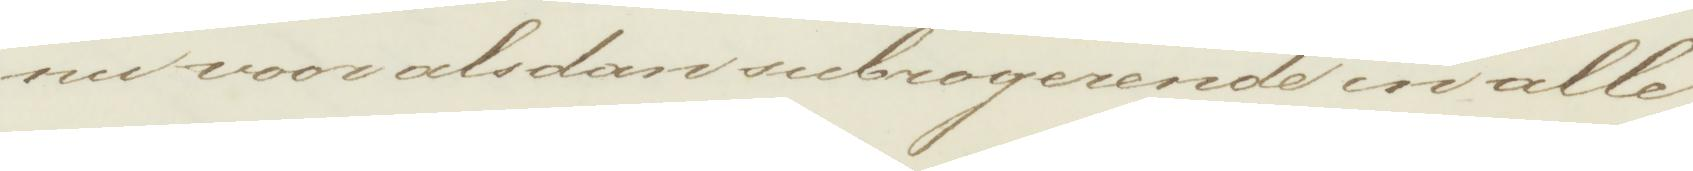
nu voor als dan subrogerende in alle
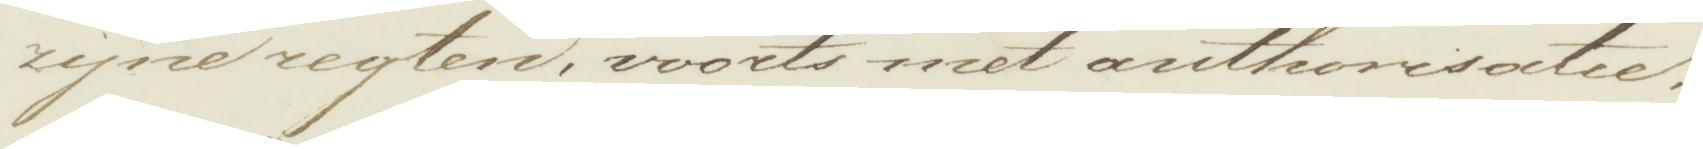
zijne regten, voorts met authorisatie,
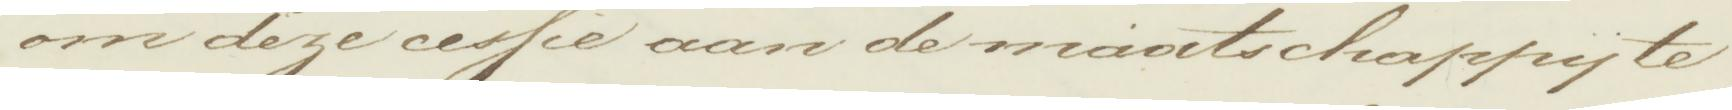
om deze cessie aan de maatschappij te
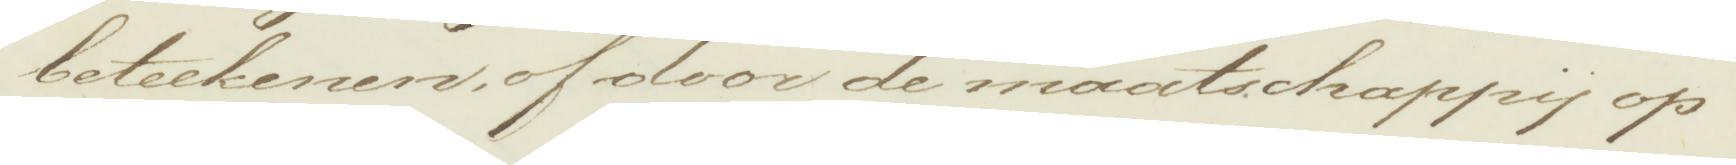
beteekenen, of door de maatschappij op
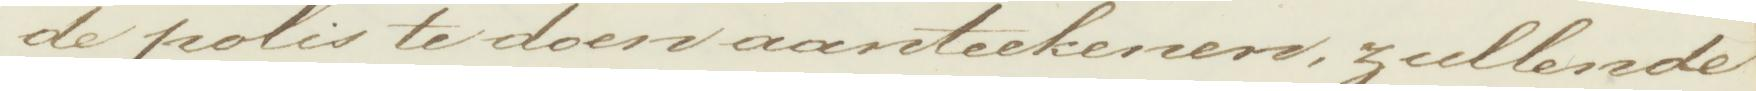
de polis te doen aanteekenen, zullende
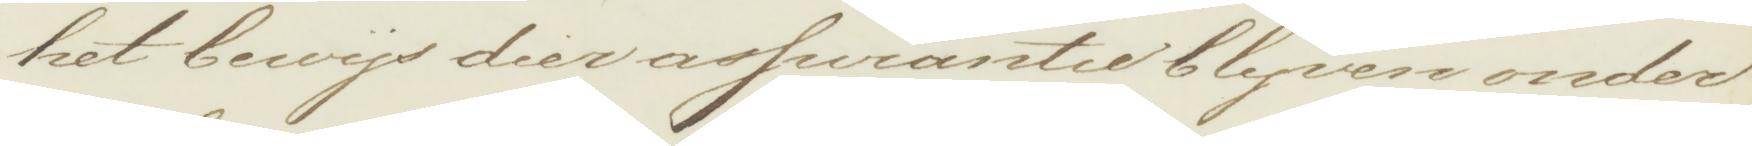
het bewijs dier assurantie blyven onder
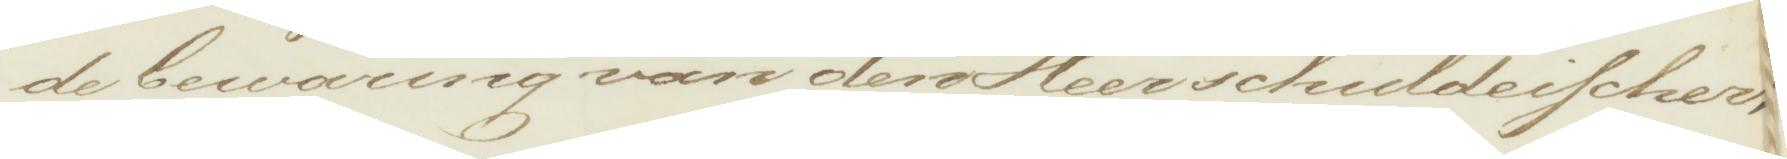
de bewaring van den Heer schuldeischer,
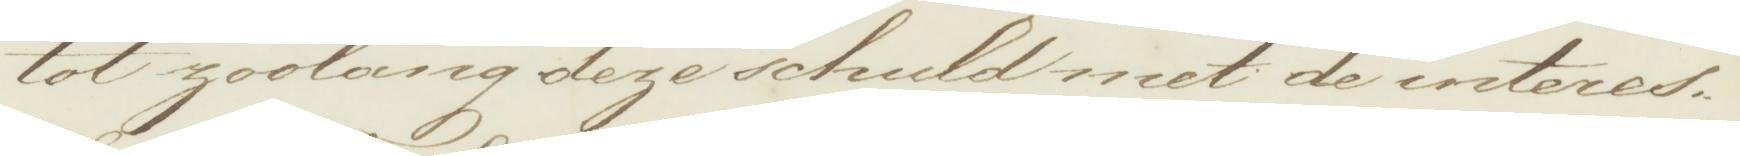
tot zoolang deze schuld met de interes„
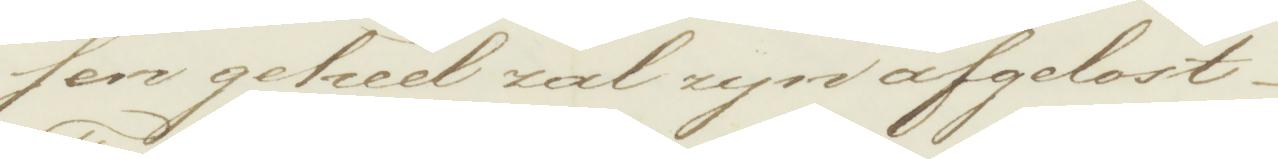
sen geheel zal zijn afgelost-
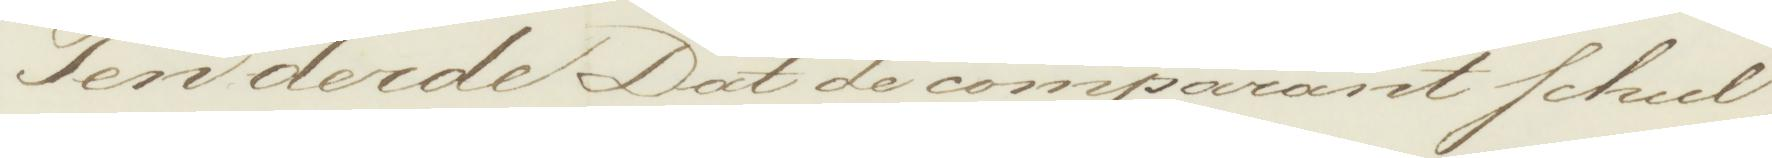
Ten derde Dat de comparant schul
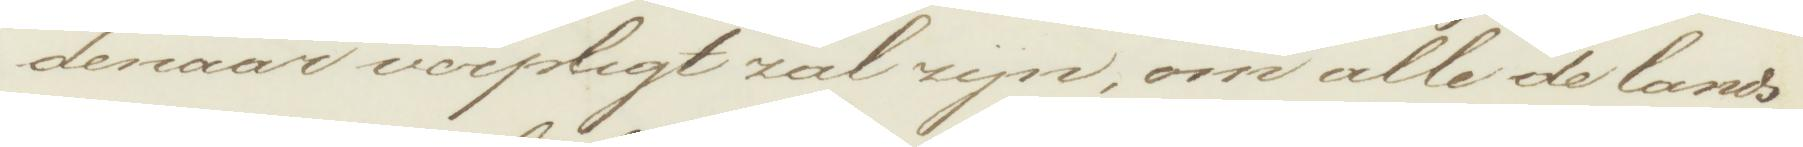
denaar verpligt zal zijn, om alle de lands
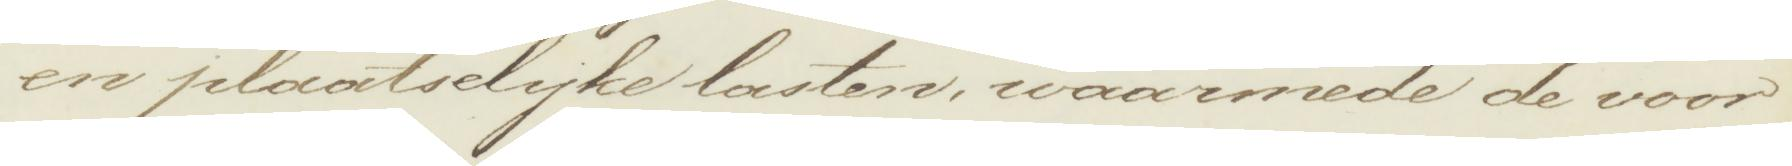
en plaatselyke lasten, waarmede de voor
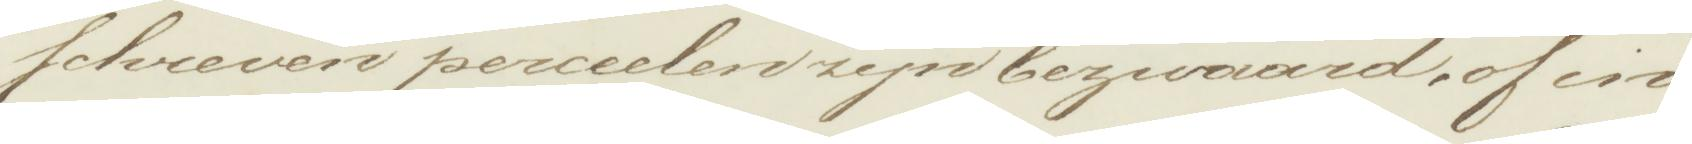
schreven perceelen zijn bezwaard, of in
